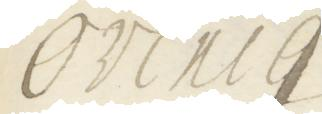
overig
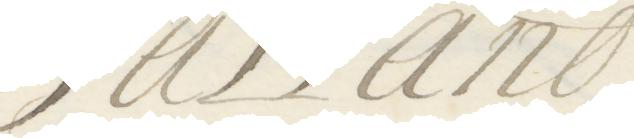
Salland
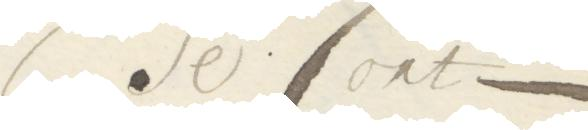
Te Cort
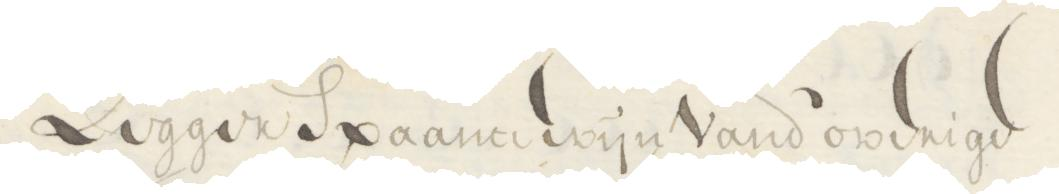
½ Legger spaance wijn van d’overige
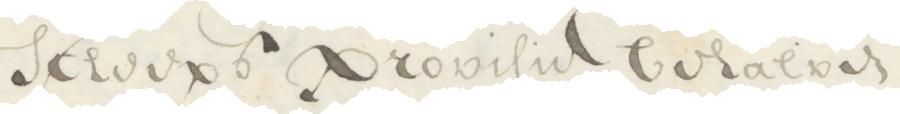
scheeps provisie behalven
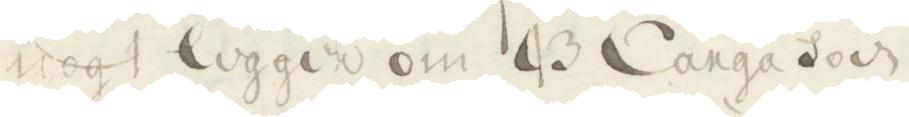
nog 1 legger om 43 Cargasoen
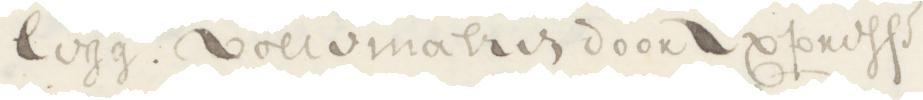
legg.n voltemaken door expresse
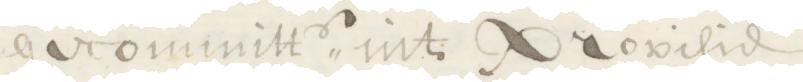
gecommitt„s int provisie
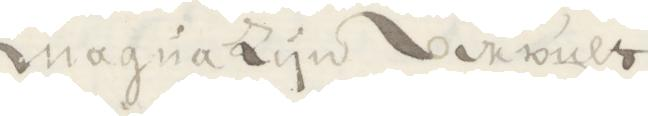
Maguazijn vervult
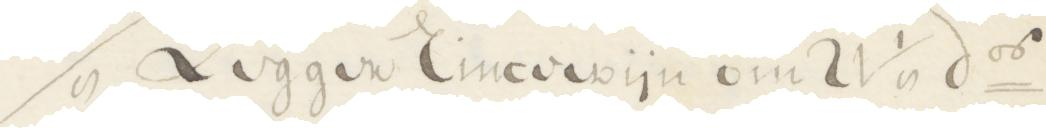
1/8 Legger Rincewijn om 21 1/8 d=os
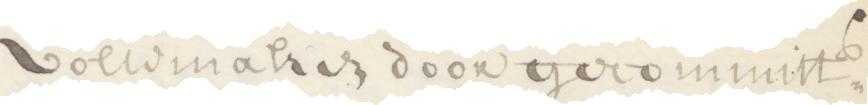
voltemaken door gecommitt„s
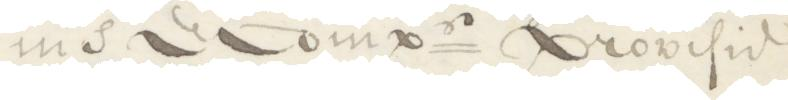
in ’s E Comp=s provisie
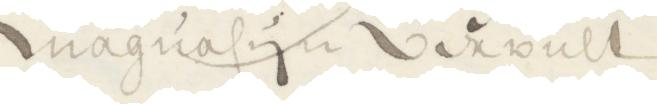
maguasijn vervult
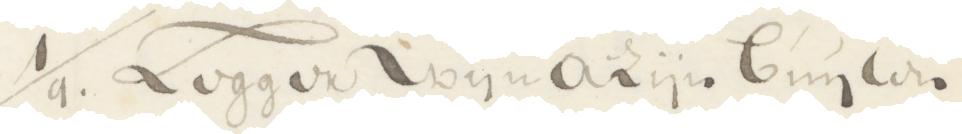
¼. Legger wijn Azijn buijten
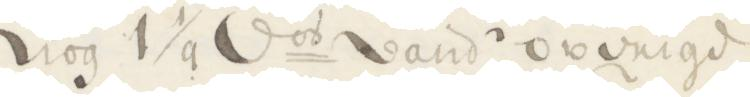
nog 1¼ D=os vand’ overige
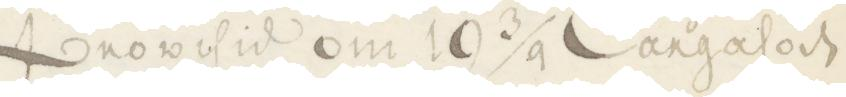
provisie om 19¾ Cargasoen
